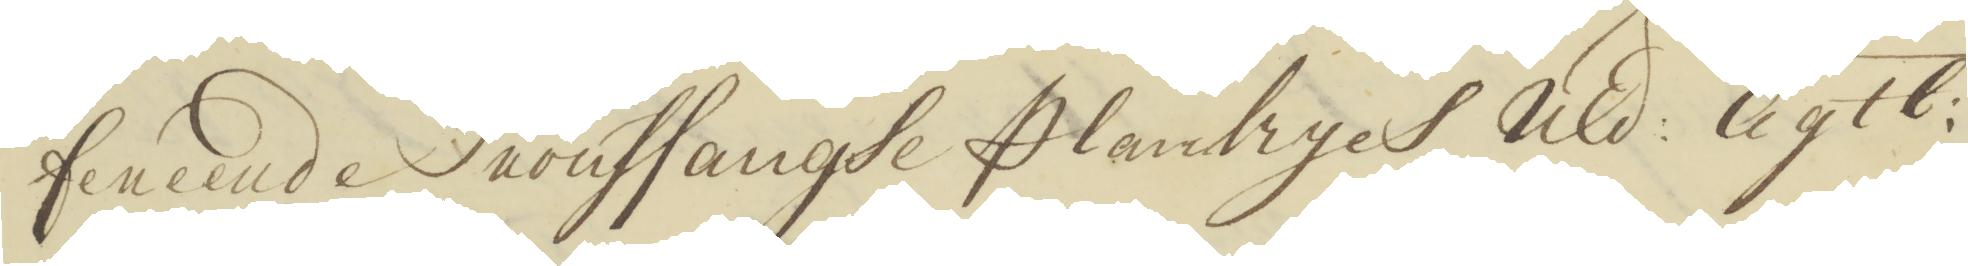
fereerde Troussangse plankjes UEd: Agtb:
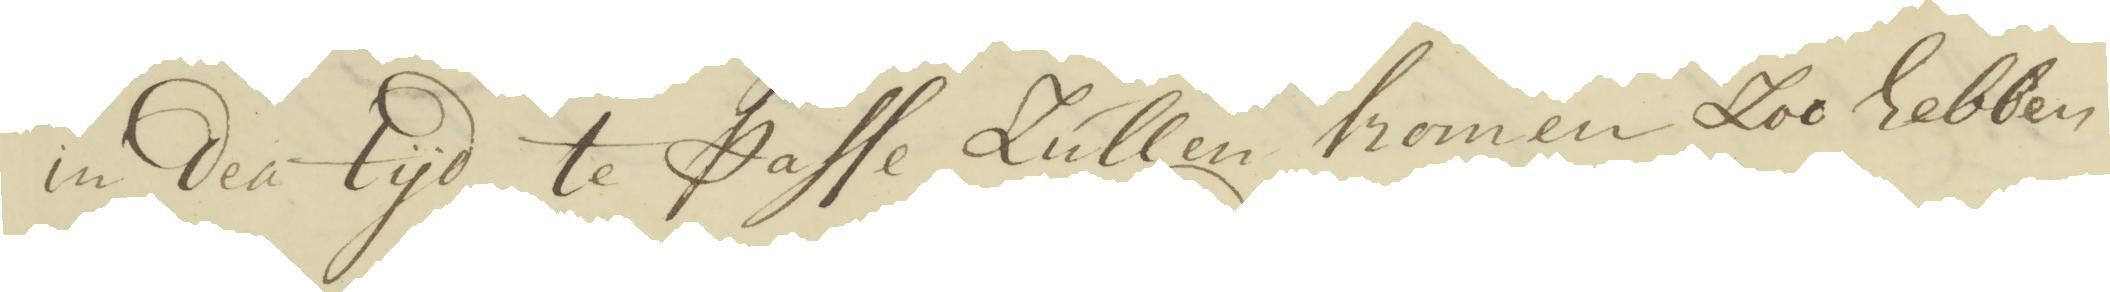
in den tijd te passe zullen komen zoo hebben
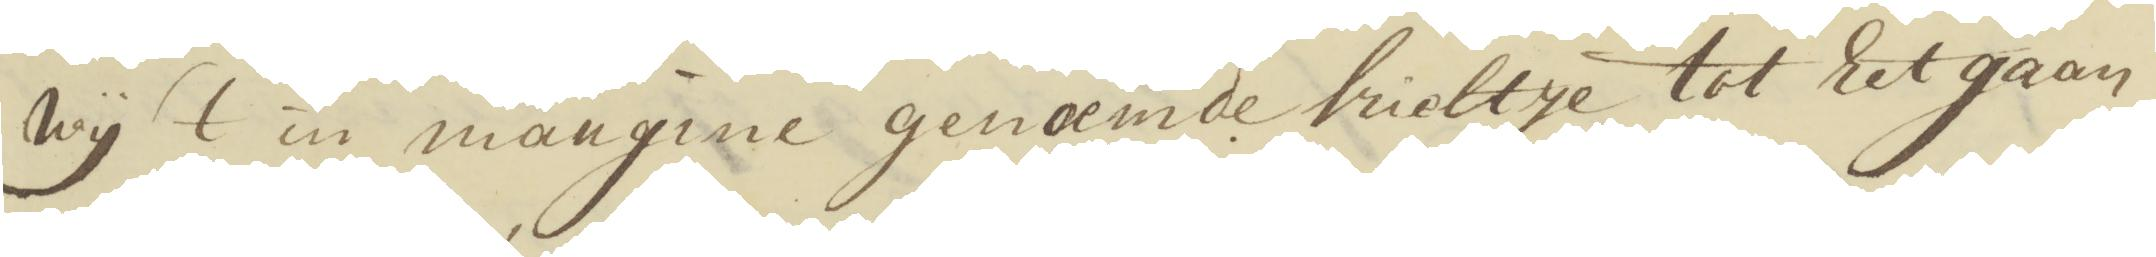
wij ’t in margine genoemde kieltje tot het gaan
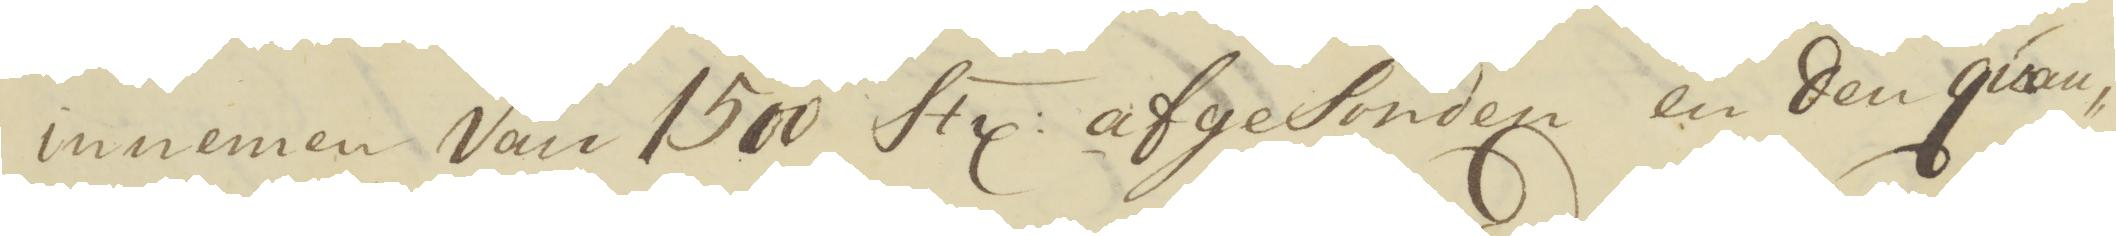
innemen van 1500 stx: afgesonden en den quau„
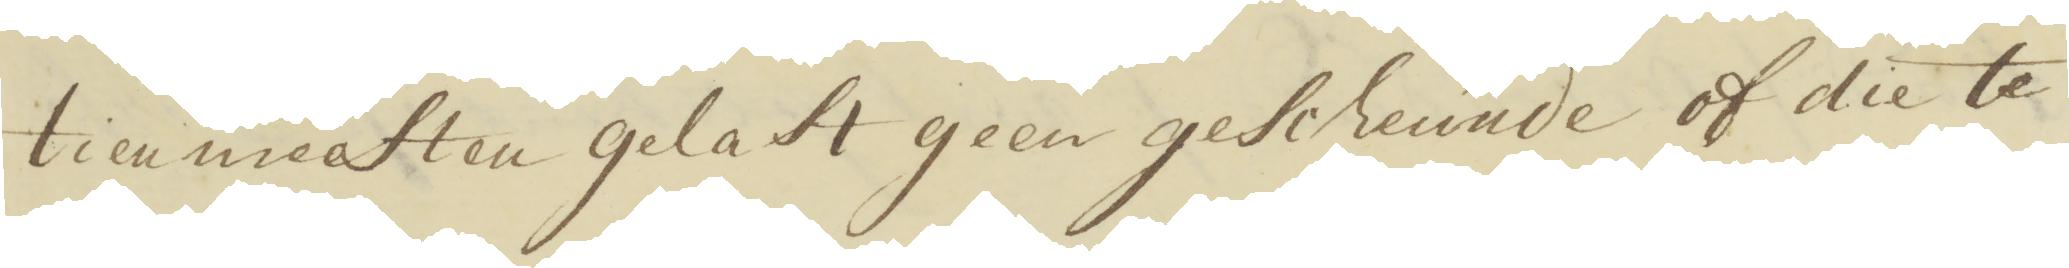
tiermeester gelast geen gescheurde of die te
